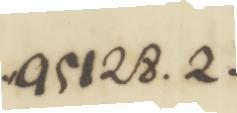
„95128. 2
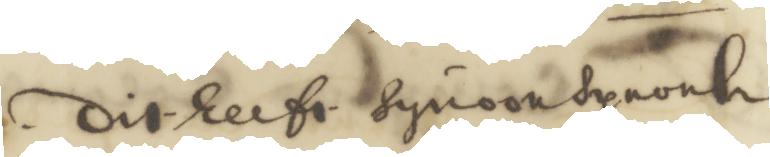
dit heeft sijn oorspronk
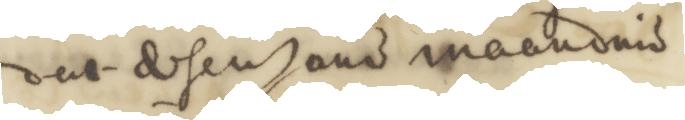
dat desenJare maardrie
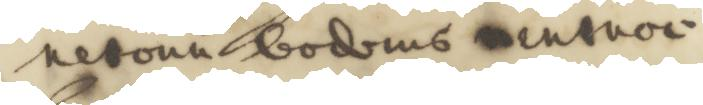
retour bodems vertroc
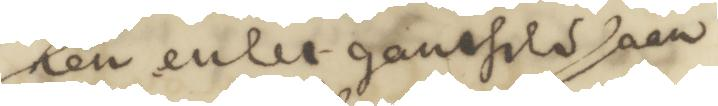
ken enhet gantsche Jaar
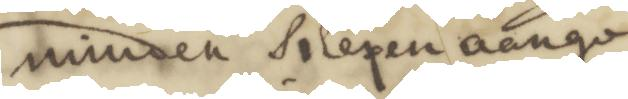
minder schepen aange
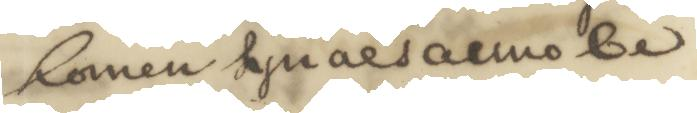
komen sijn als anno be
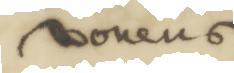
vorens
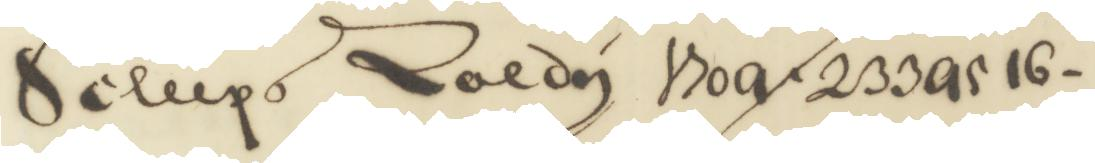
ScheepsZoldij 1704 ƒ23345 16-
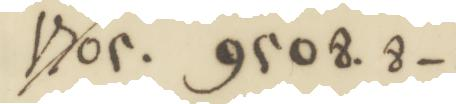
1705. 9508. 8-
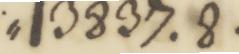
„ 13837. 8
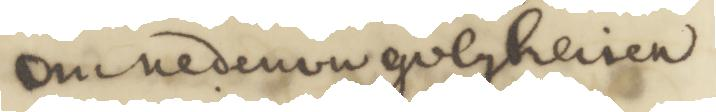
omredenen gelykliter
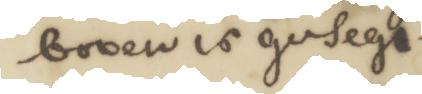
boven is gesegt
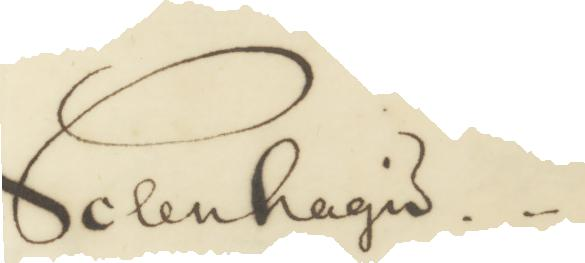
Schenkagie - -
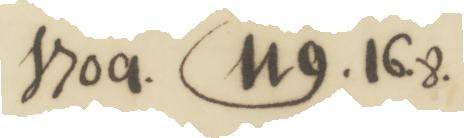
1704. 119.16.8.
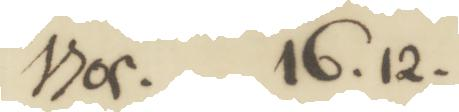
1705. 16.12-
